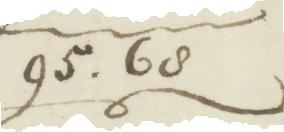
95.68
